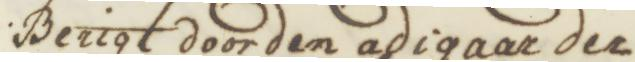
Berigt door den adigaar der
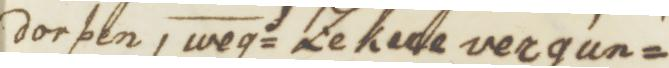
dorpen, weg=s Zekere vergun=
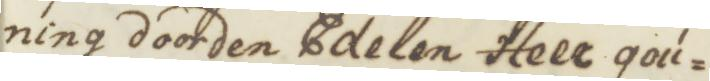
ning door den Edelen Heer gou=
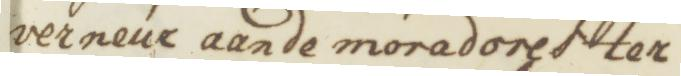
verneur aan de moradores ter
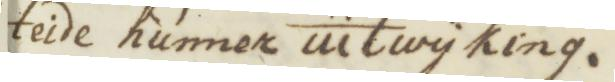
teide hunner uitwijking.
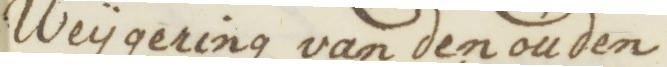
Weijgering van den ouden
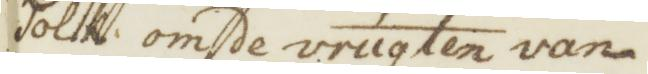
Tolk om de vrugten van
